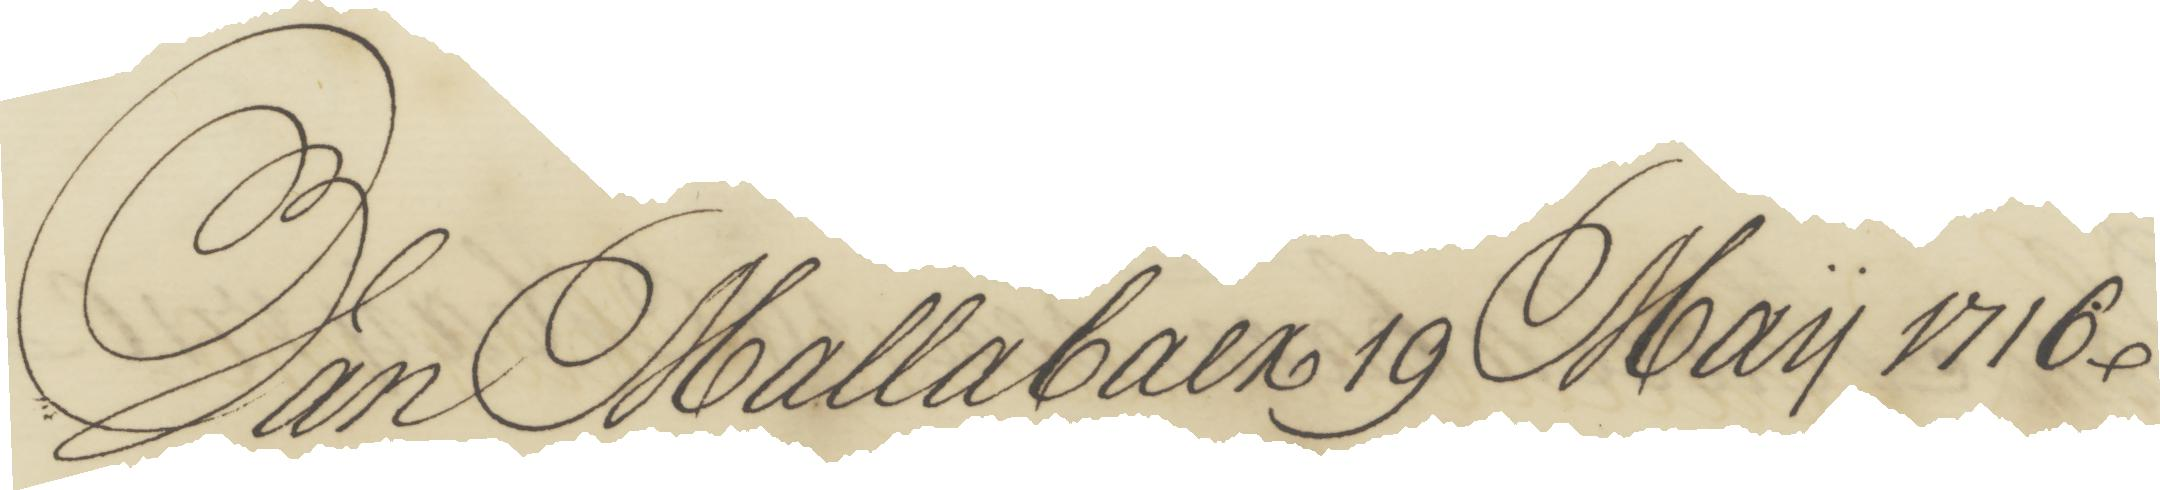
Van Mallabaer 19 Maij 1716–
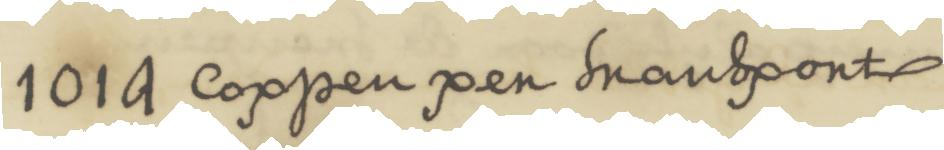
1014 coppen per transport
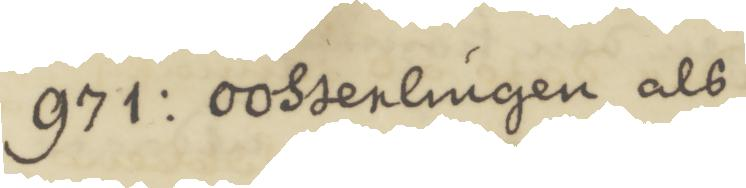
971: oosterlingen als
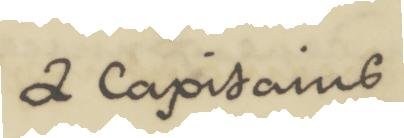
2 capitains
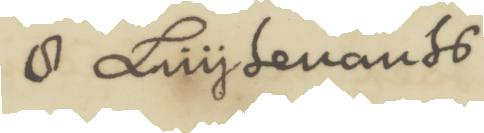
8 Luijtenants
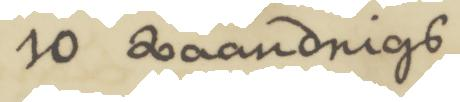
10 vaandrigs
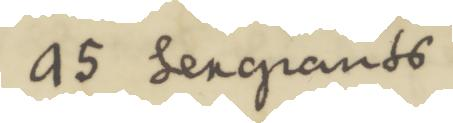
45 sergiants
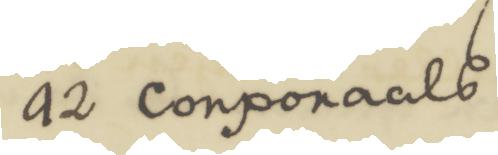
42 corporaals
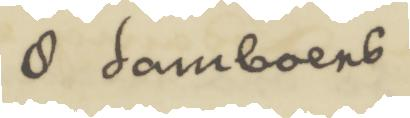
8 tamboers
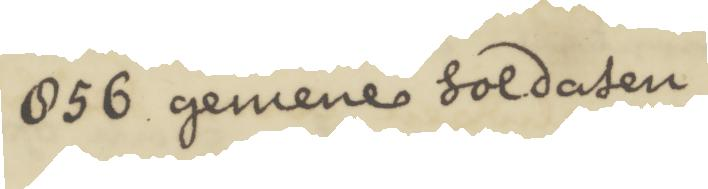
856 gemene soldaten
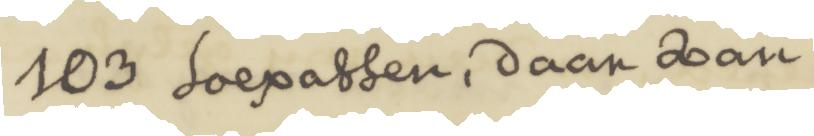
103 toepassen, daar van
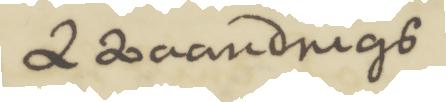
2 vaandrigs
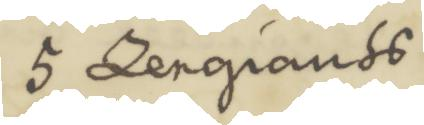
5 zergiants
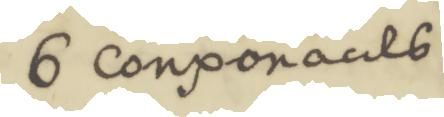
6 corporaals
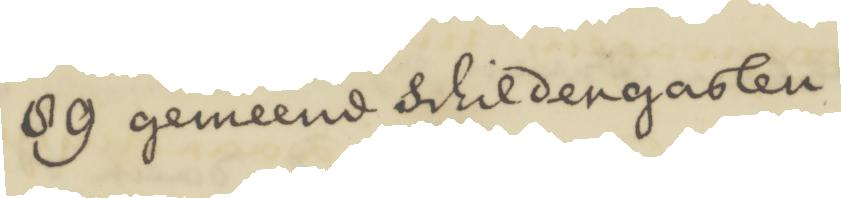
89 gemeene schildergasten
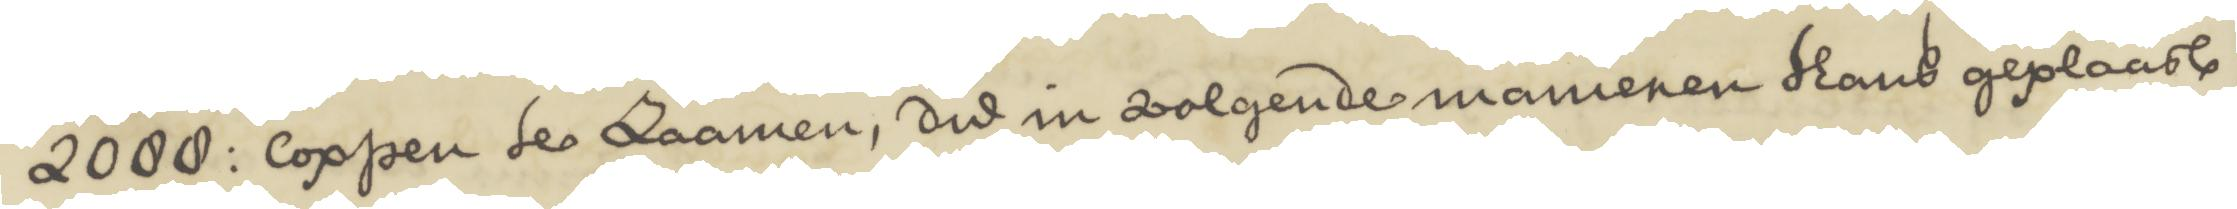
2088: coppen te zaamen, die in volgende manieren thans geplaast
